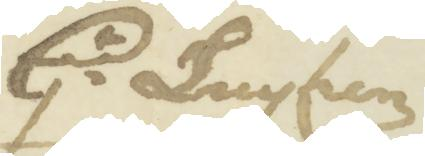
G. Luyken
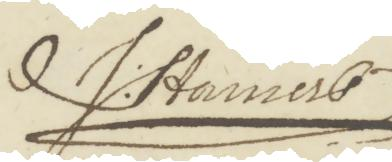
J: Stamers
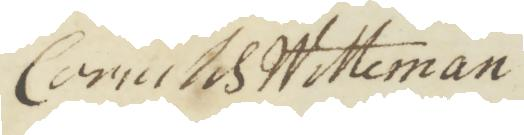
Cornelis Witteman
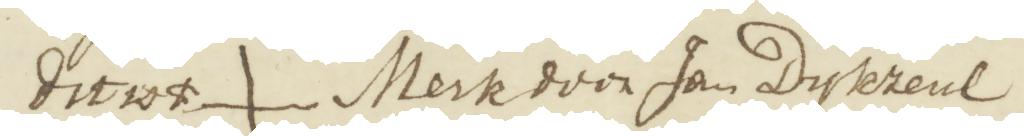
dit is t + Merk door Jan Dykzeul
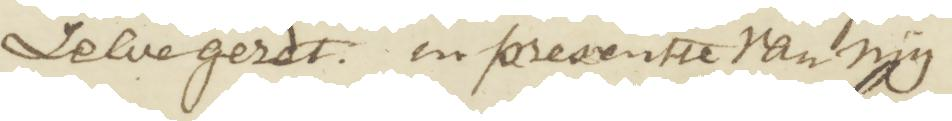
zelve gezet. in presentie van mij
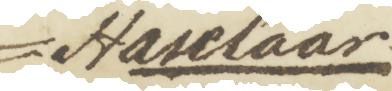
= Haselaar
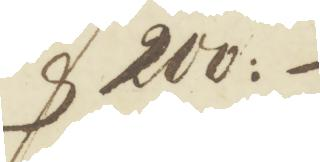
ƒ 200: —
